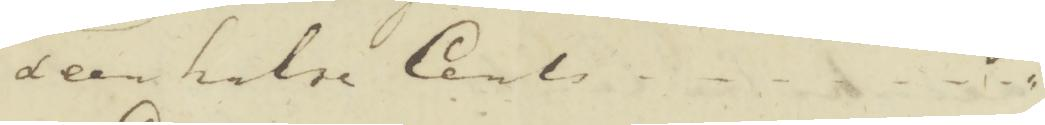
& een halve Cents - - - - - - - „
